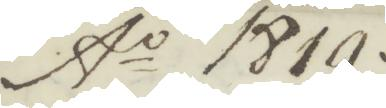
A=o 1819.
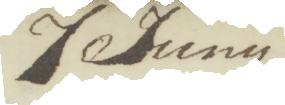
7 Juny
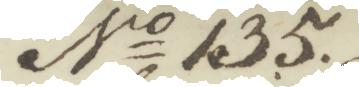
N=o 135.
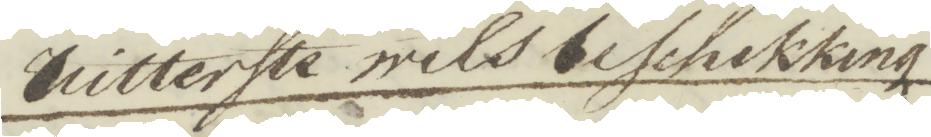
uitterste wils beschikking
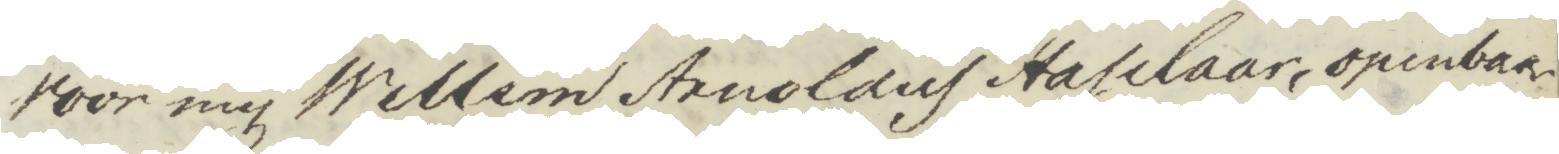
voor my Willem Arnoldus Haselaar, openbaar
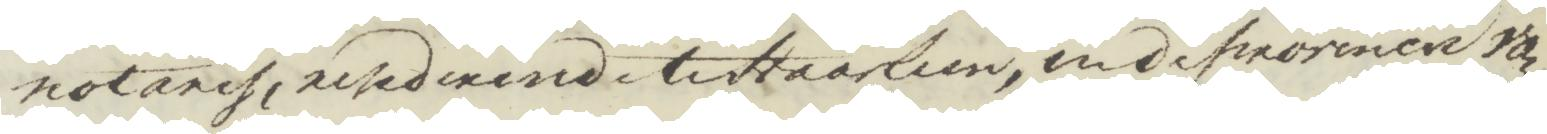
notaris, residerende te Haarlem, in de provincie van
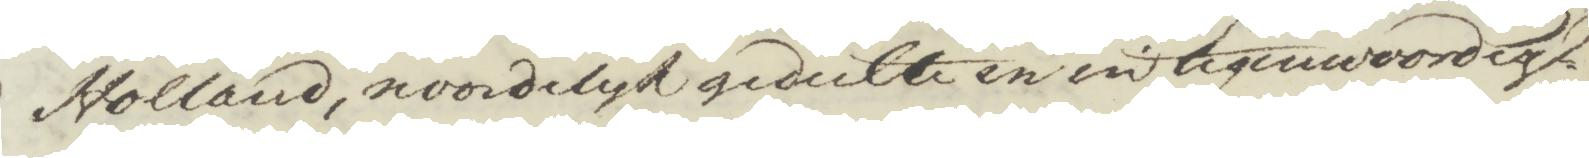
Holland, noordelyk gedeelte en in tegenwoordig=
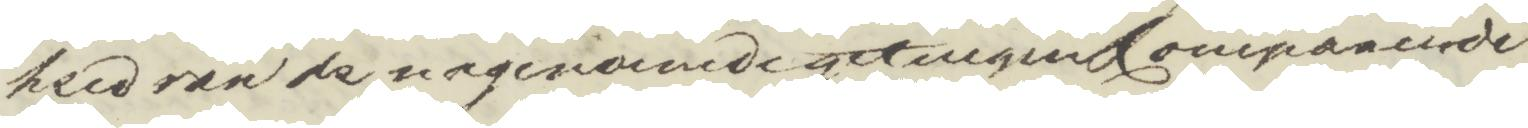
heid van de nagenoemde getuigen Compareerde
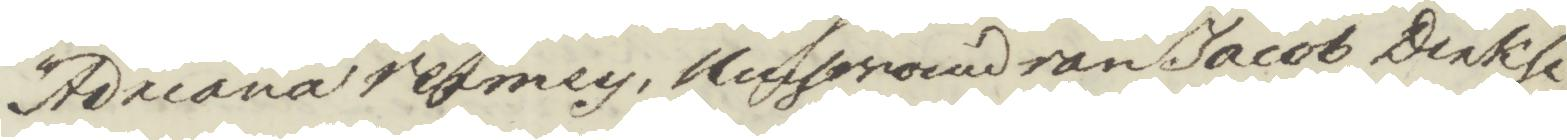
Adriana Vermey, Huisvrouw van Jacob Derkse
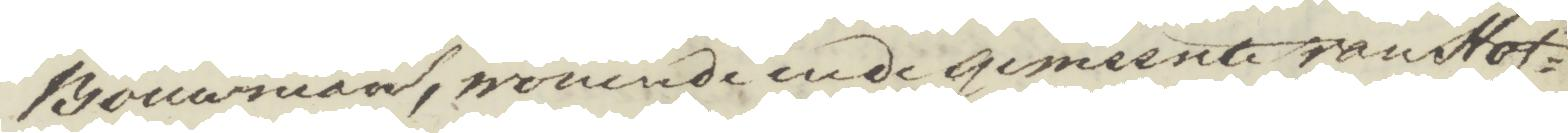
Bouwman, wonende in de gemeente van Hof=
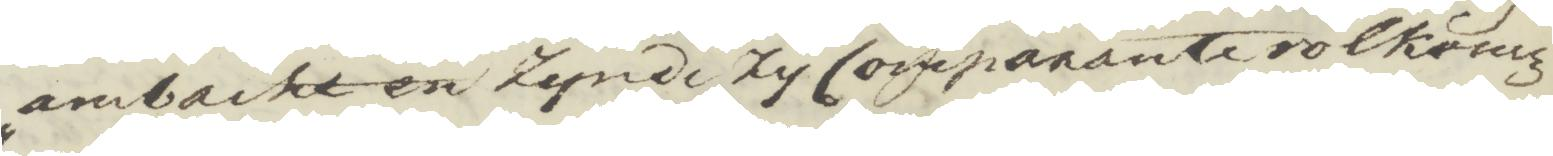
ambacht en zynde zy Comparante volkomen
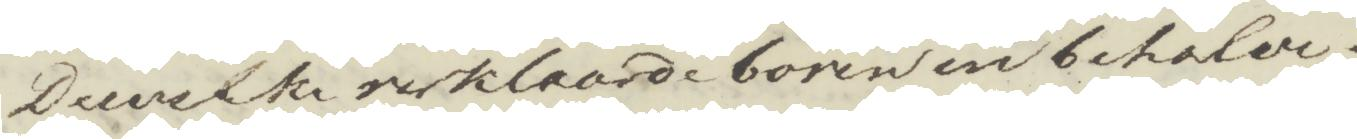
Dewelke verklaarde boven en behalve
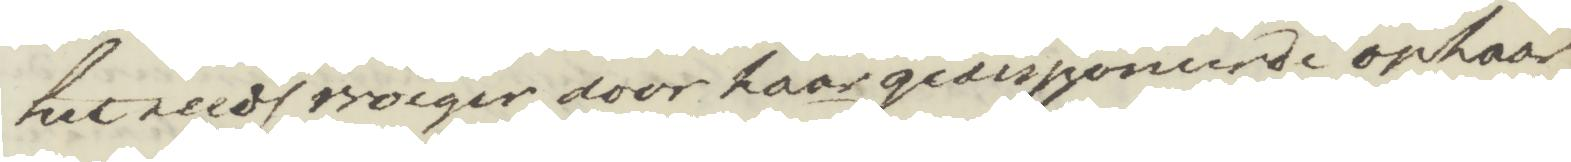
het reeds vroeger door haar gedisponeerde op haar
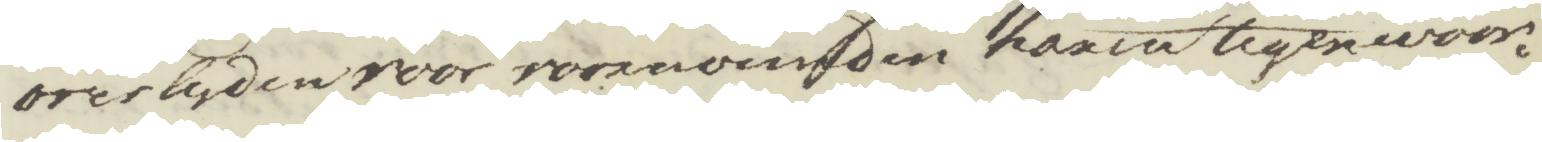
overlyden voor voornoemden haren tegenwoor„
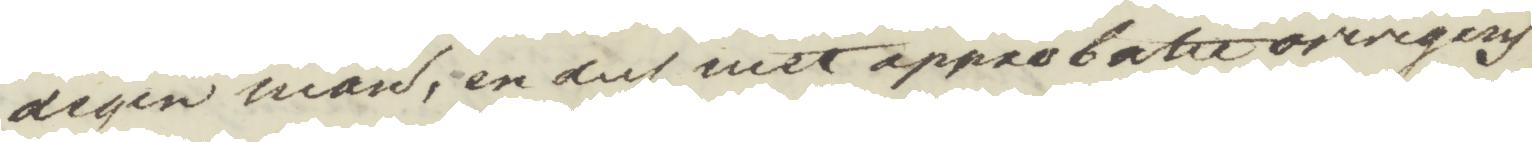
digen man, en dus met approbatie overigens
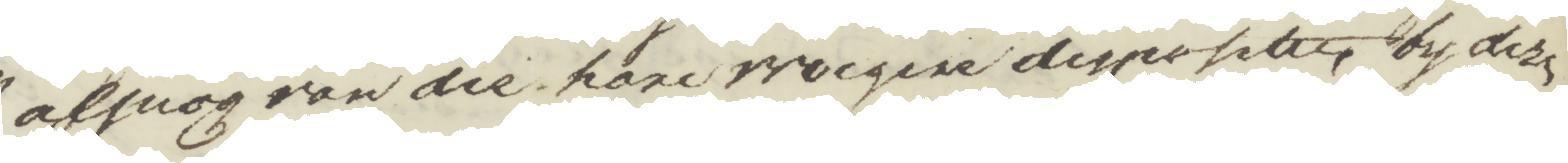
alsnog van die hare vroegere dispositie by deze
